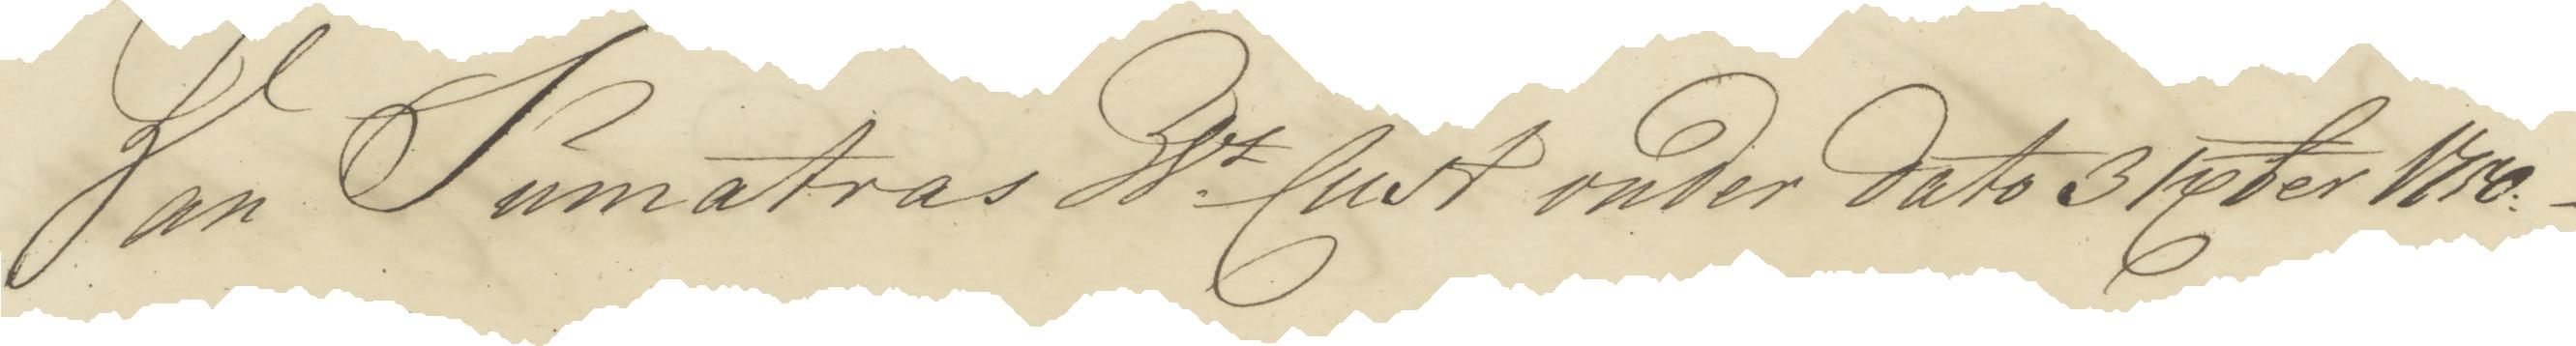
Van Sumatras W:t Cust onder dato 31xber 1750.
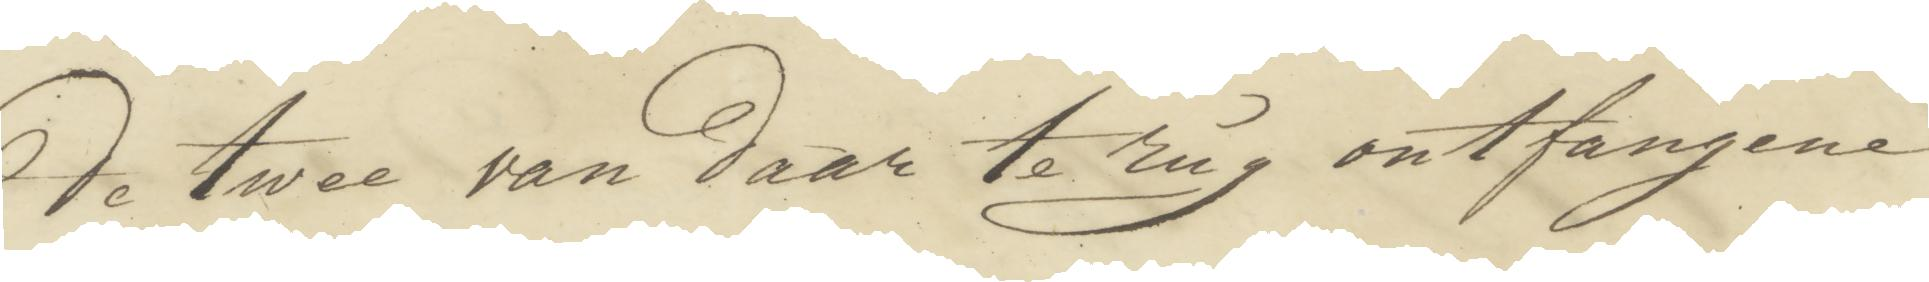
de twee van daar te rug ontfangene
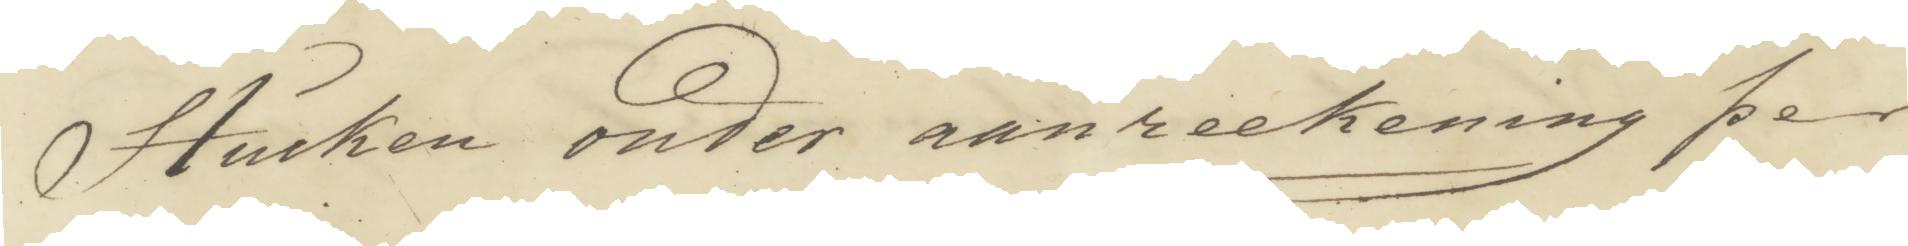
Stucken onder aanreekening per
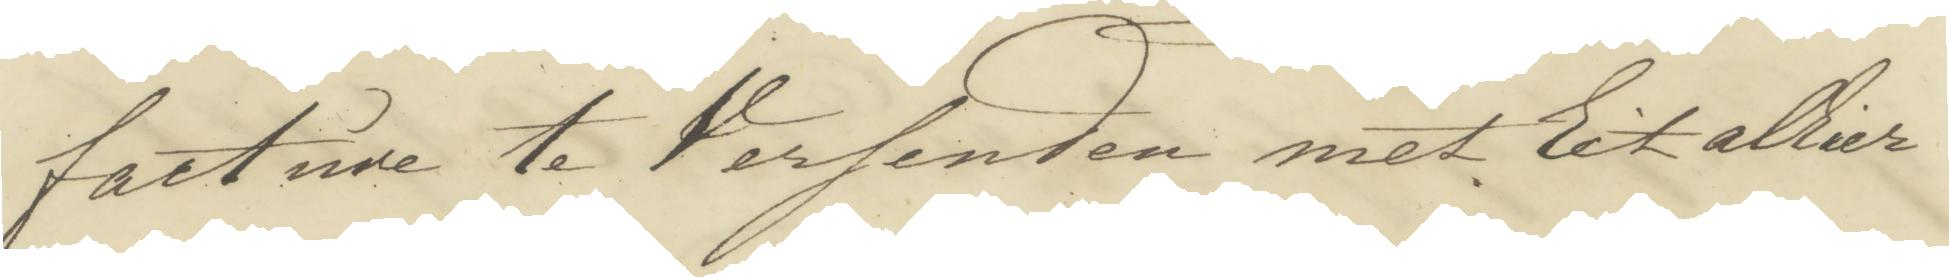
facture te Versenden met het alhier
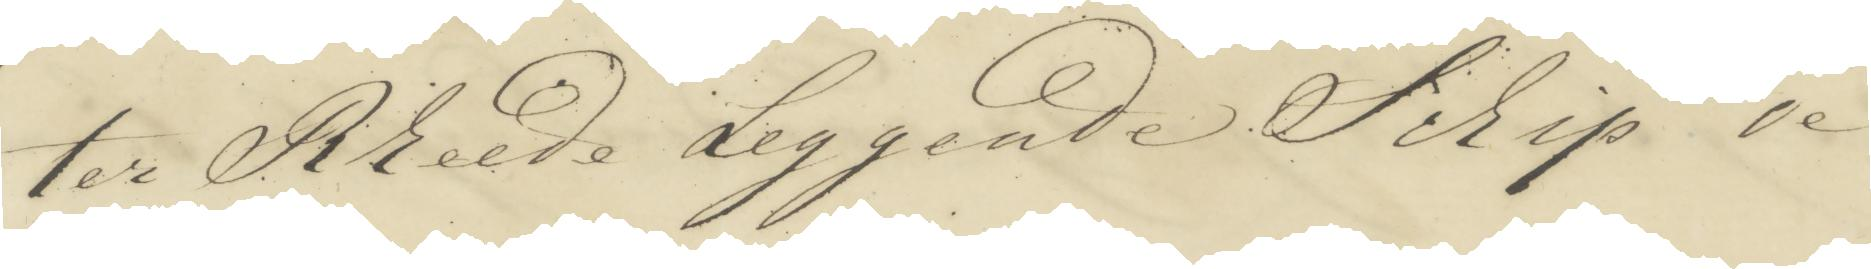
ter Rheede leggende Schip de
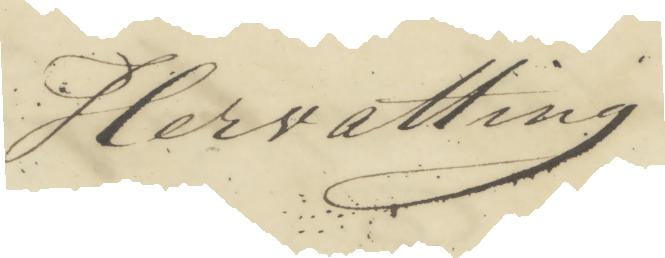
Hervatting
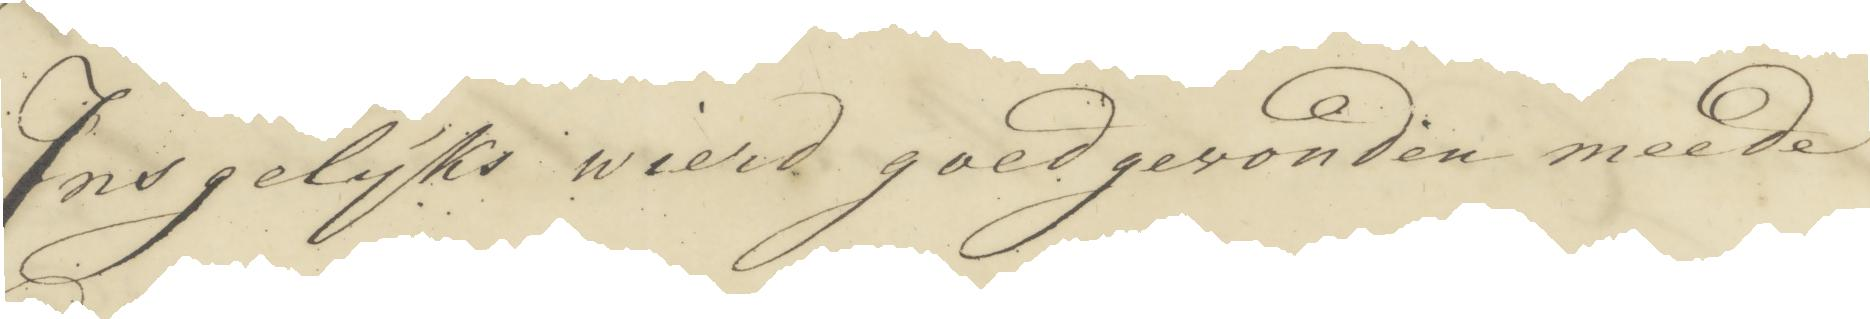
Jns gelijks wierd goed gevonden meede
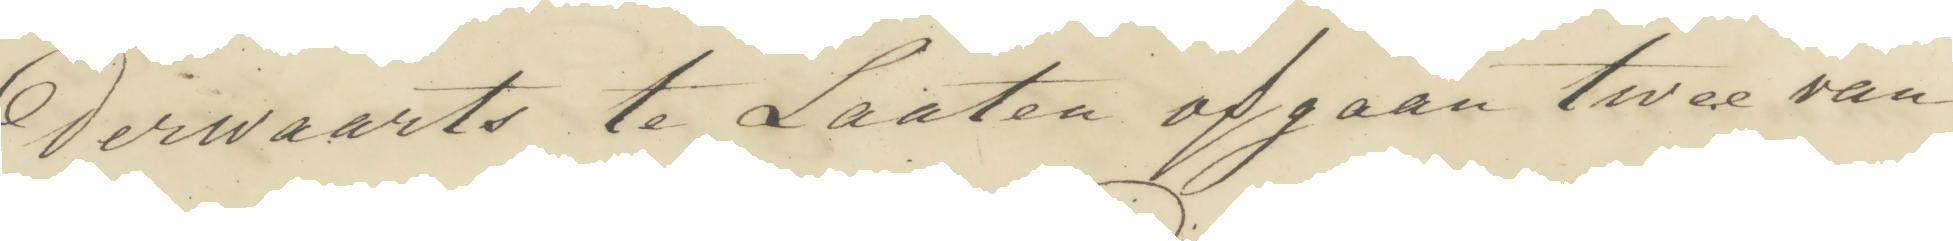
derwaarts te Laaten overgaan twee van
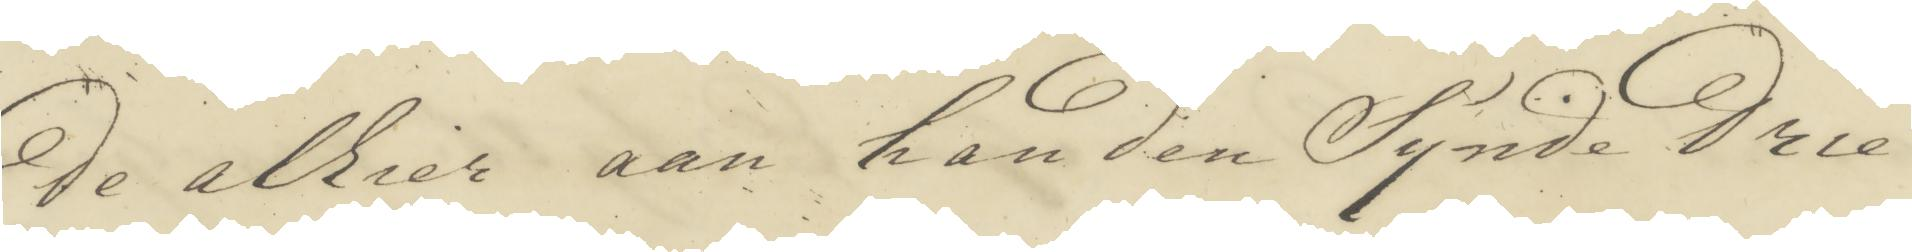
de alhier aan handen Sijnde drie
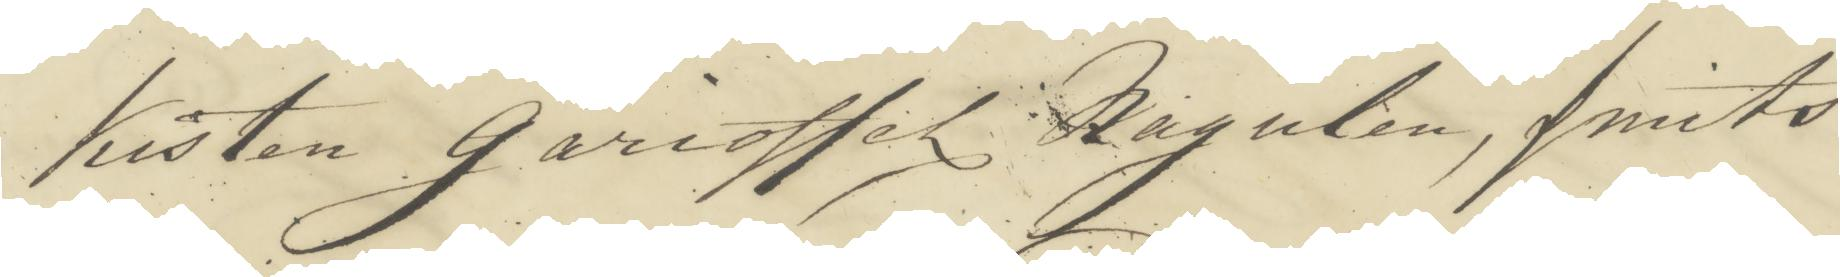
kisten garioffel Nagulen, vermits
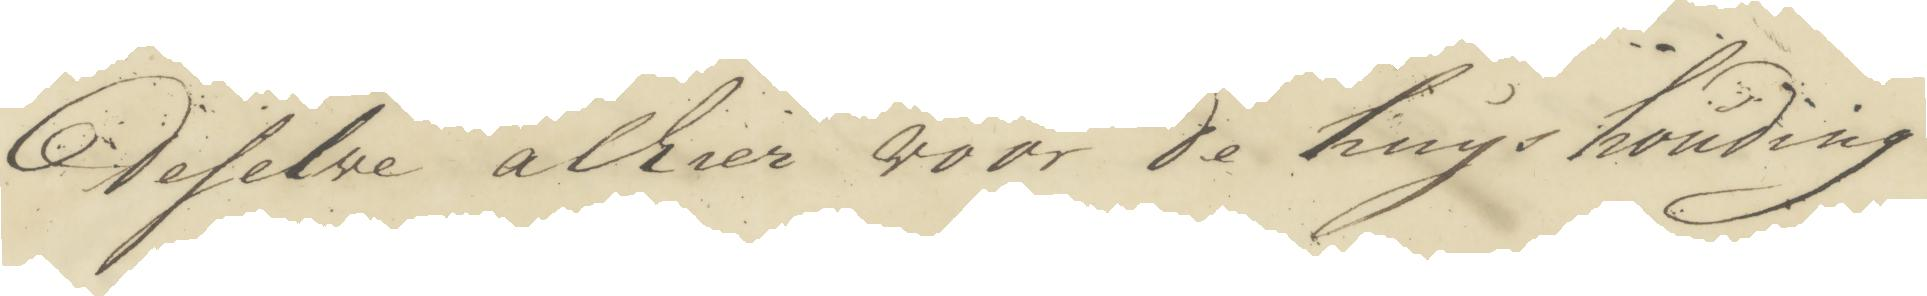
deselve alhier voor de huijs houding
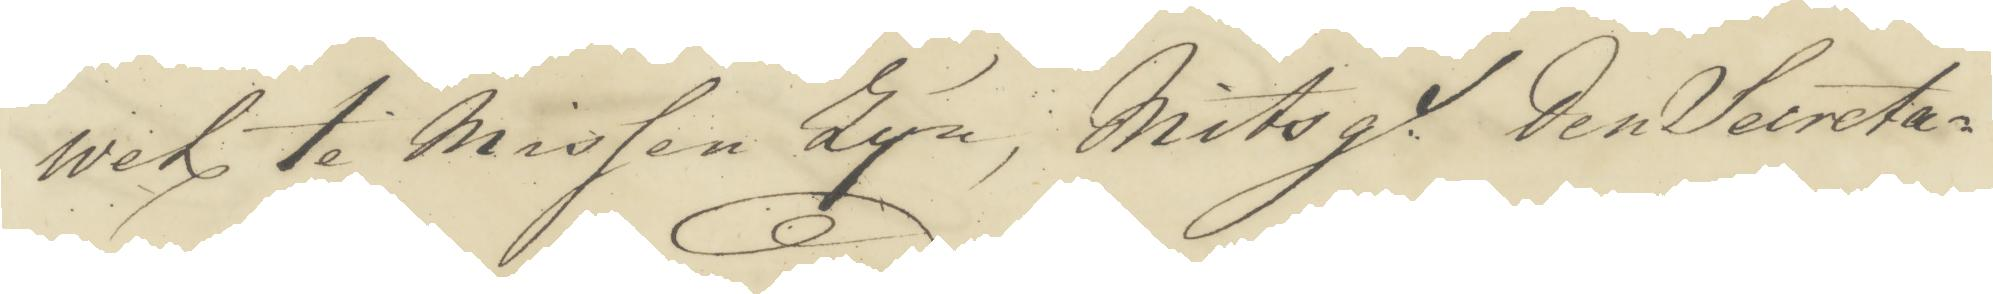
wel te missen Zijn; mitsg:s den Secreta=
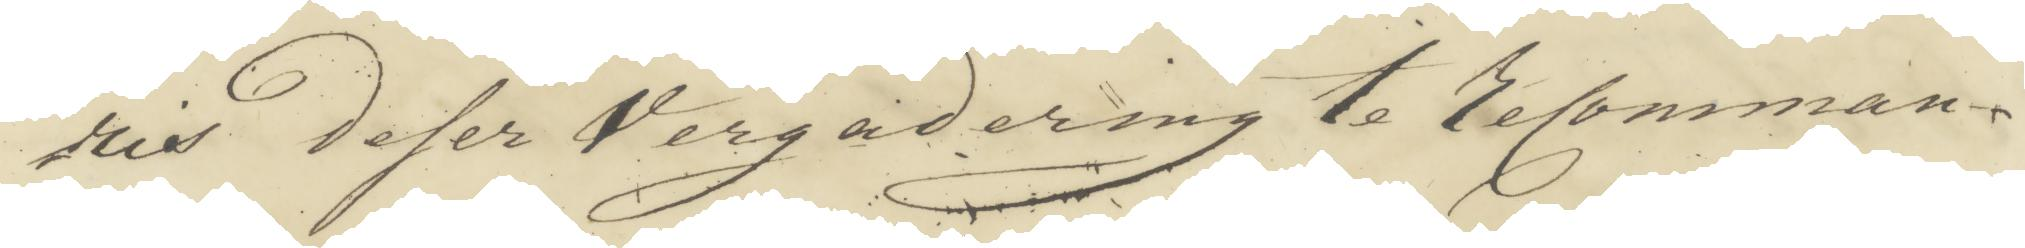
ris deser Vergadering te recomman=
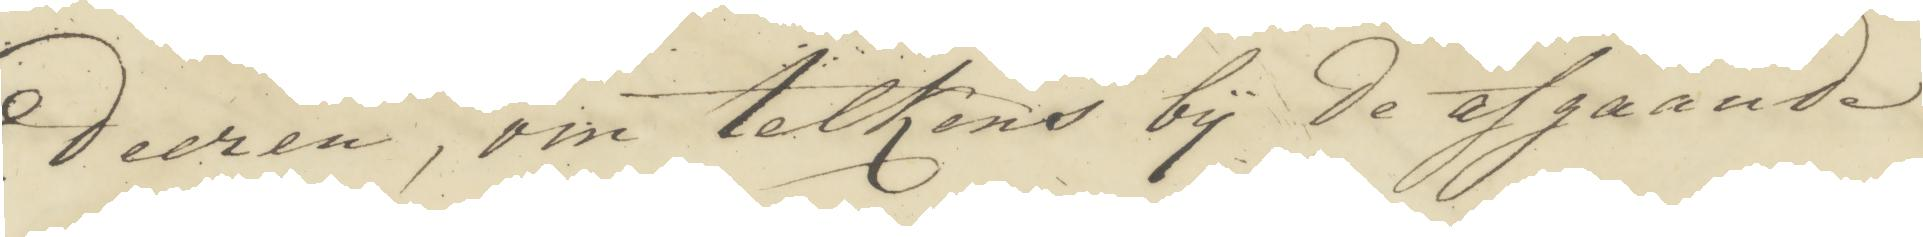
deeren om telkens bij de afgaande
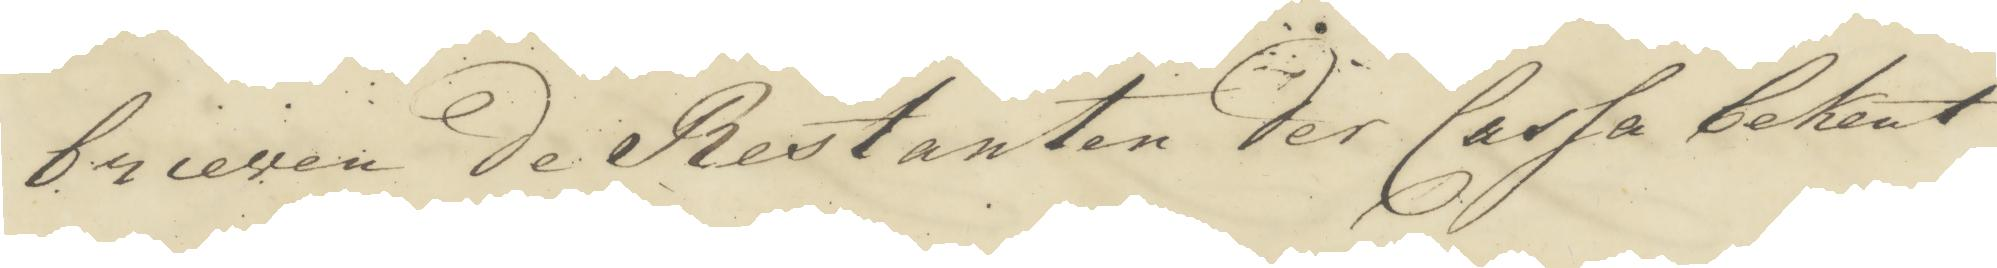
brieven de Restanten der Cassa bekent
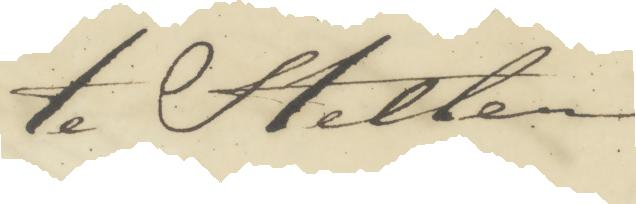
te Stellen.
